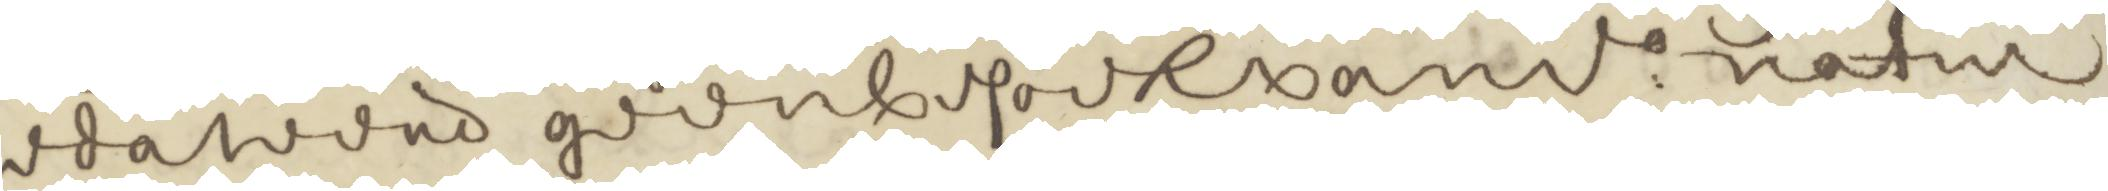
gedateerd geen besoek van E:e natie
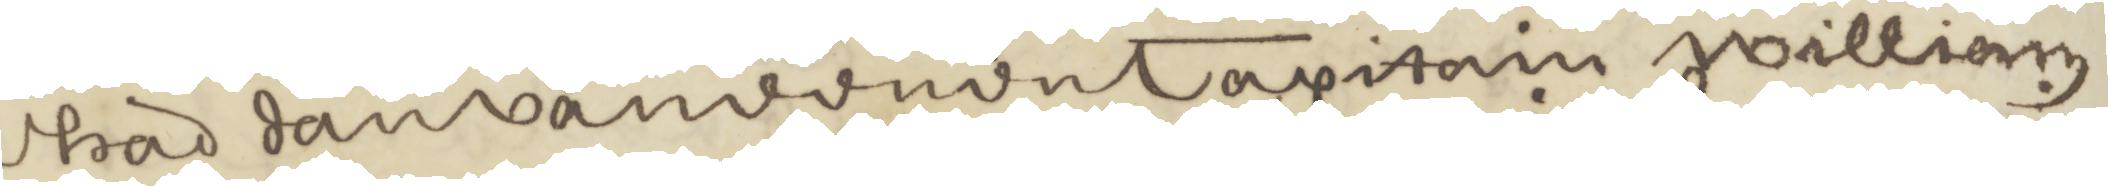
gehad dan van eenen Capitain william
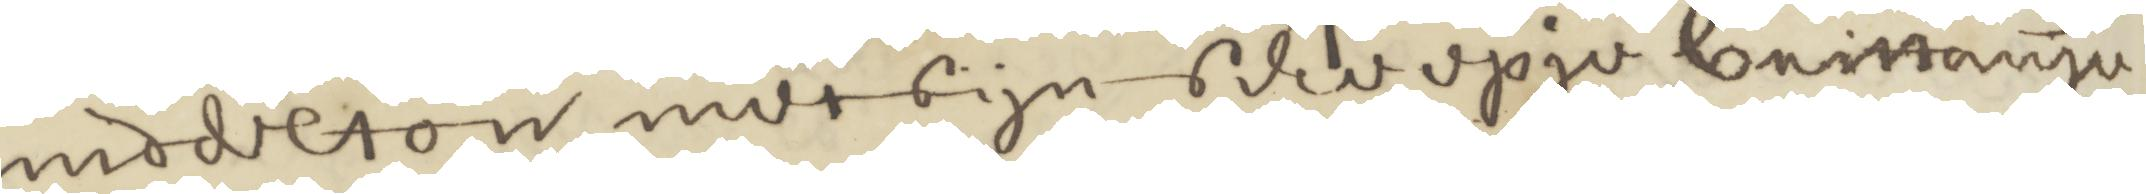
middelton met sijn scheepje brittanje
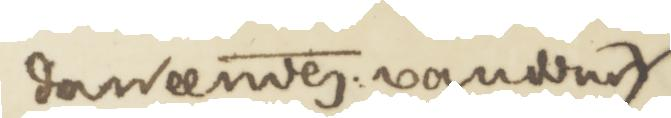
dan eenelijk vanden
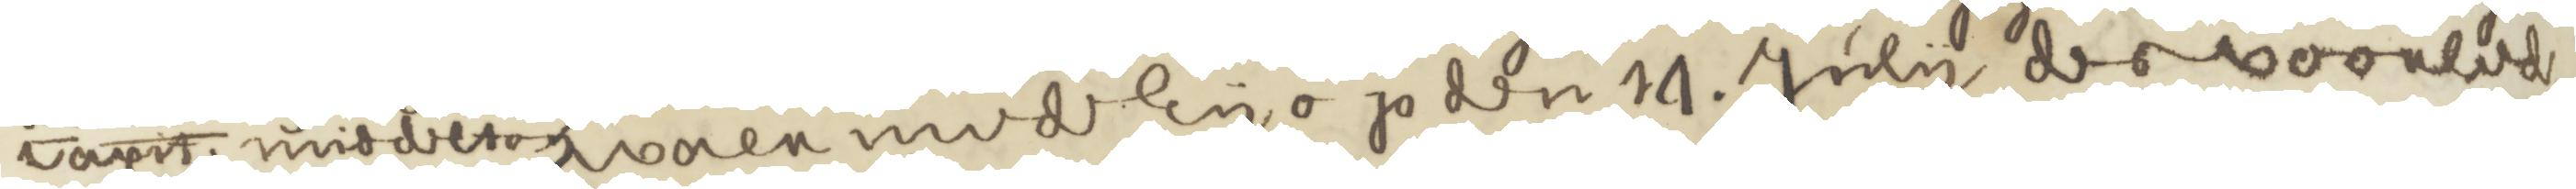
Capit. middelton waer mede hij op den 14. Julij des voorled
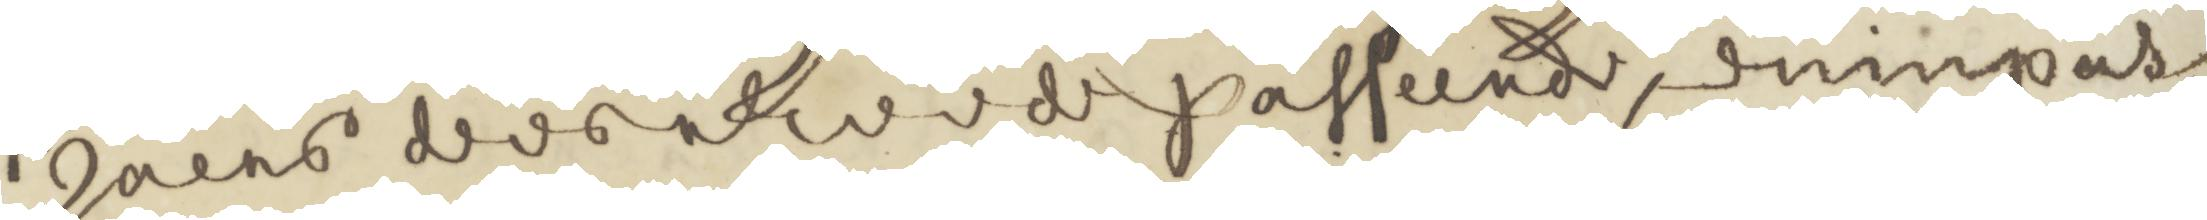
Jaers dees rheede passeerde, en in pas
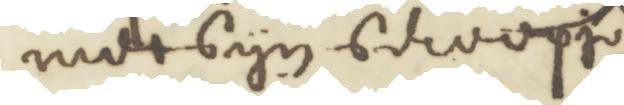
met sijn scheepje
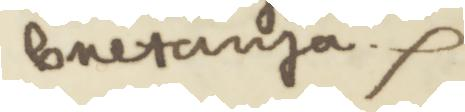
bretanja.
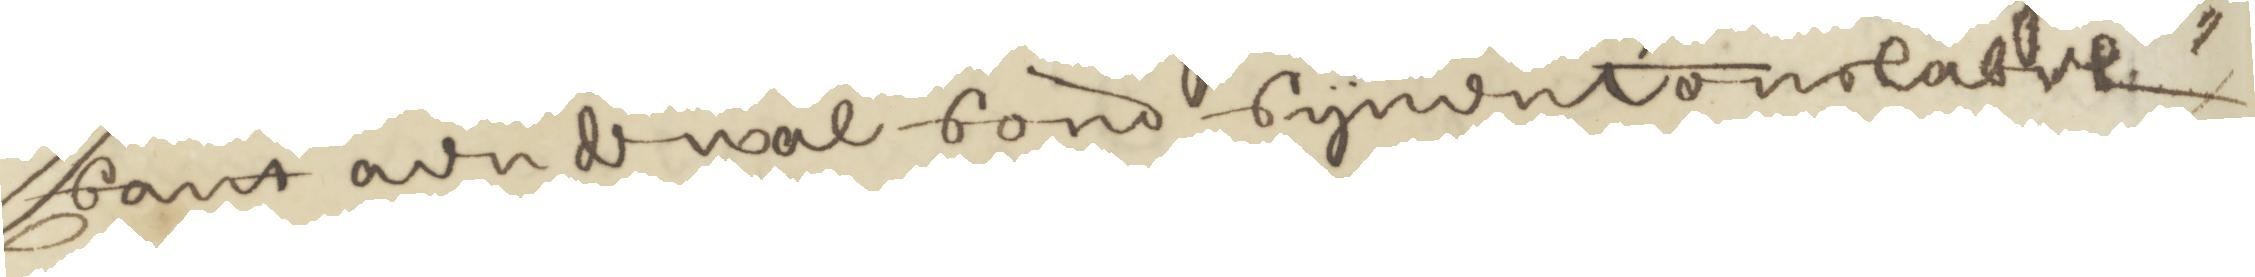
sant aen de wal sond sijnen Constabel
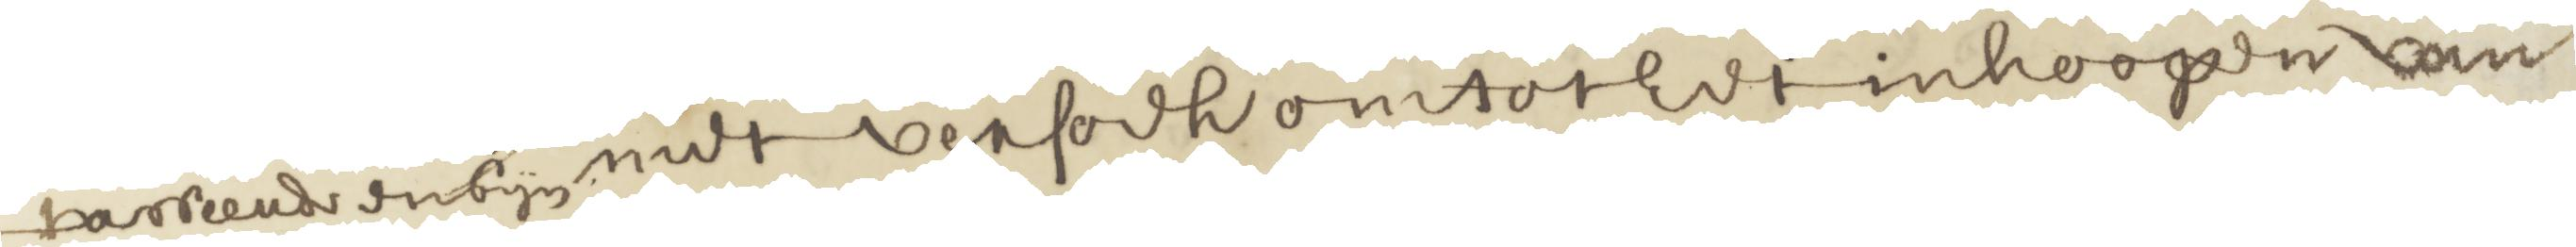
passeerde en sijn met versoek om tot het inkoopen van
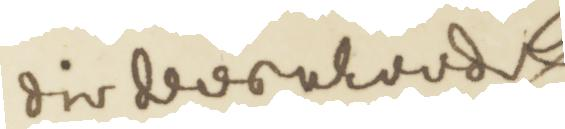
die dees rheede
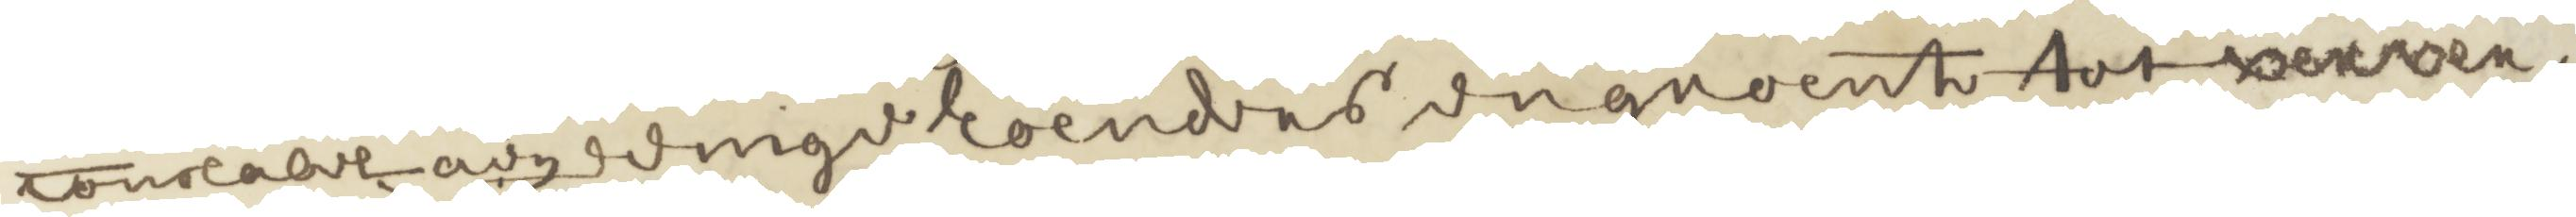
constabel aen eenige hoenders en groente tot verver„
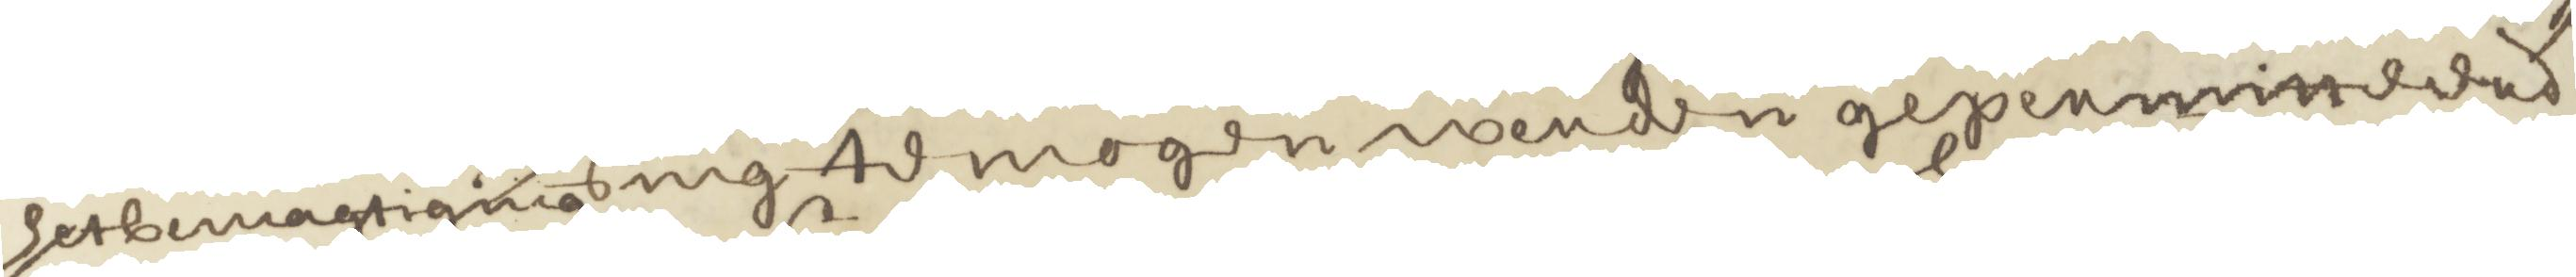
het bemagtiging sing te mogen werden gepermitteerd
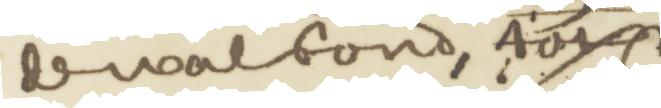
de wal sond, tot
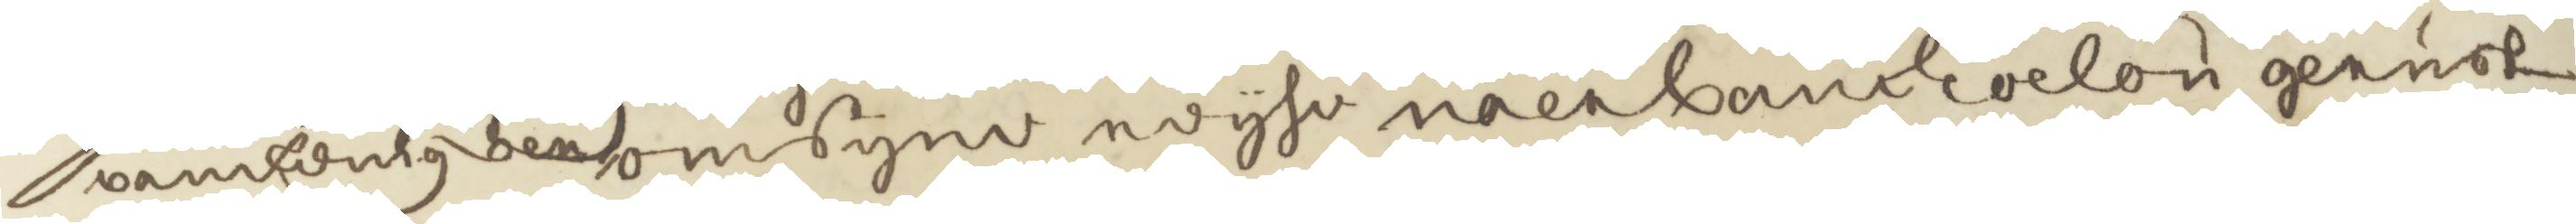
van eenig ver„ om sijne reijse naer banchoelou gerust
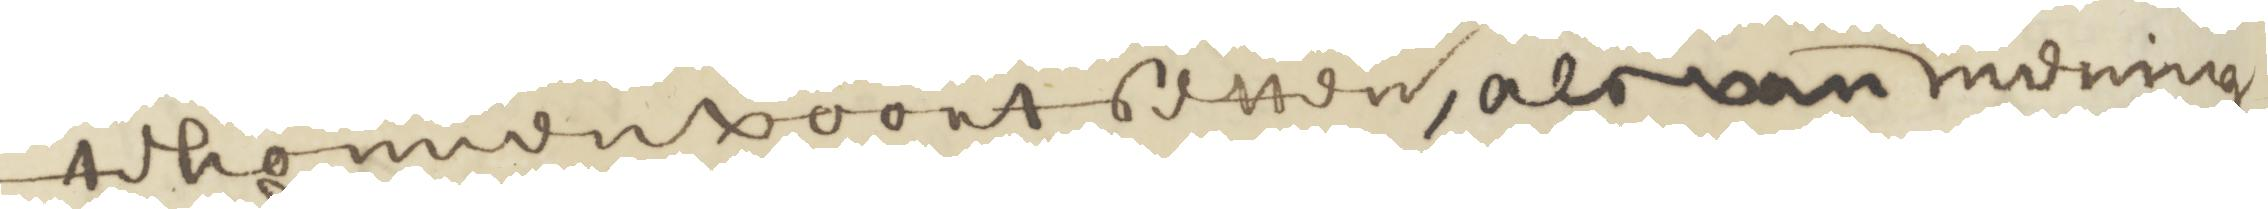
te konnen voort setten, als van mening
